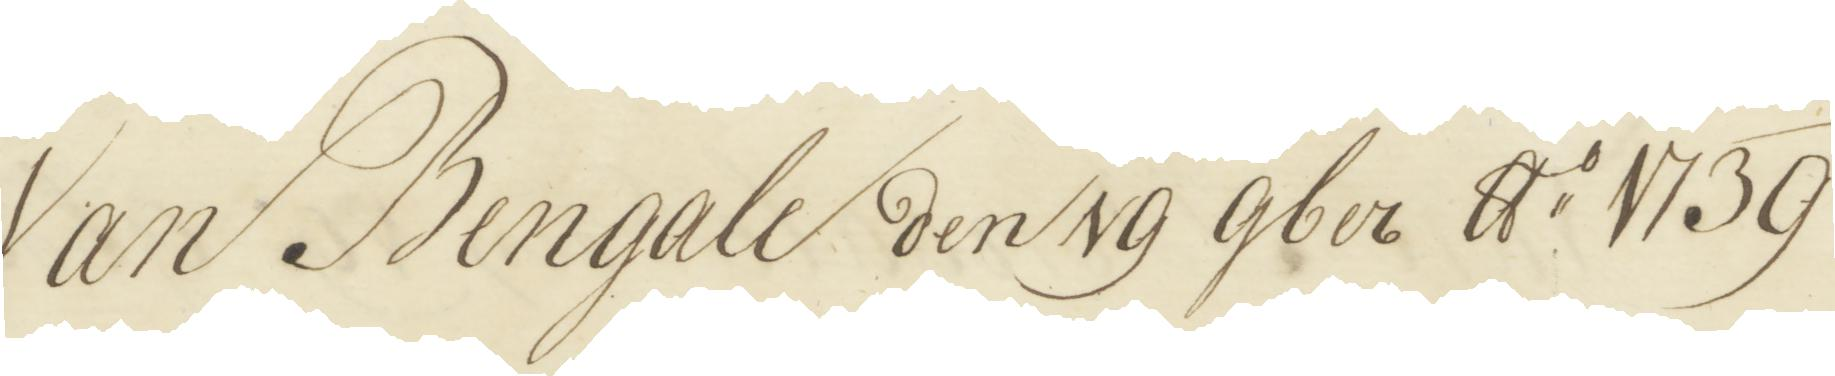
Van Bengale den 19 9ber A„o 1739
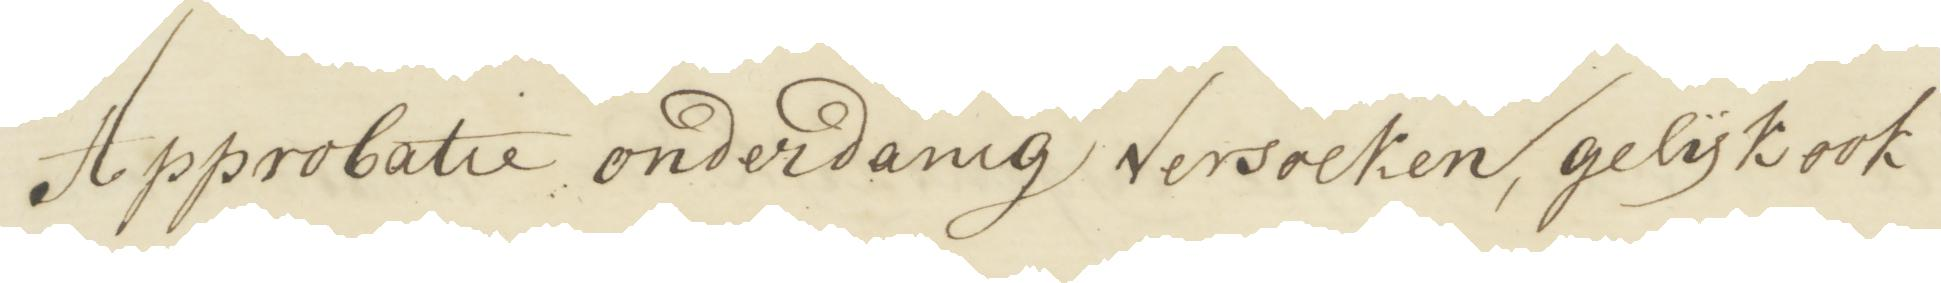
Approbatie onderdanig versoeken, gelijk ook
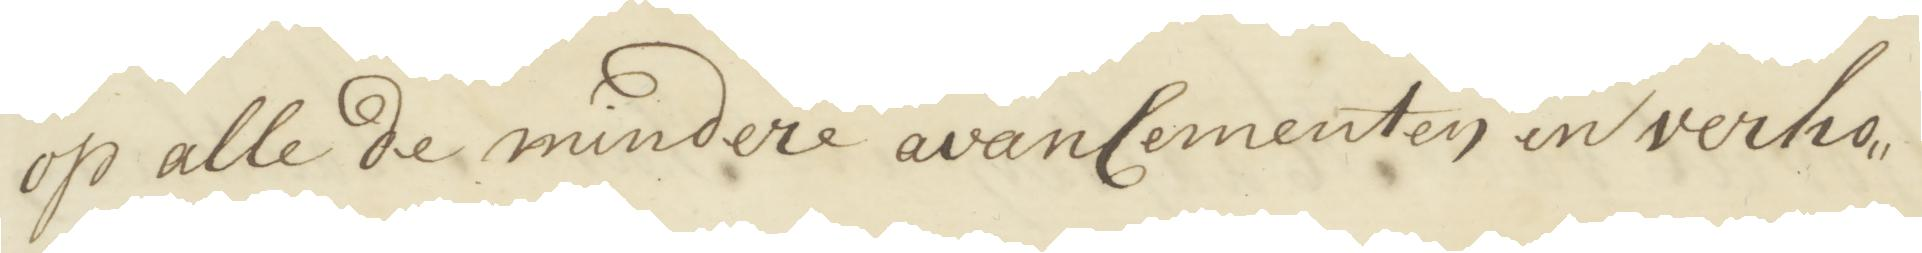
op alle de mindere avancementen en verho„
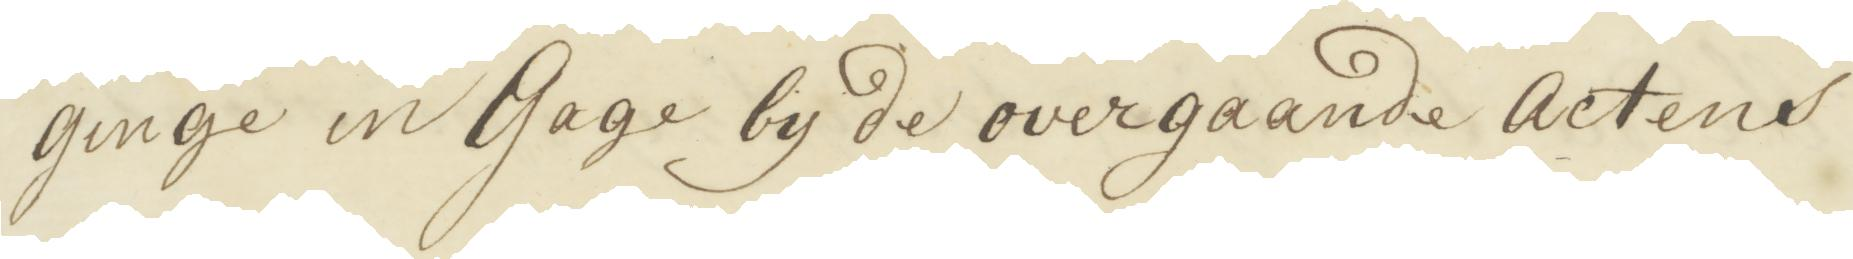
ginge in Gage bij de overgaande actens
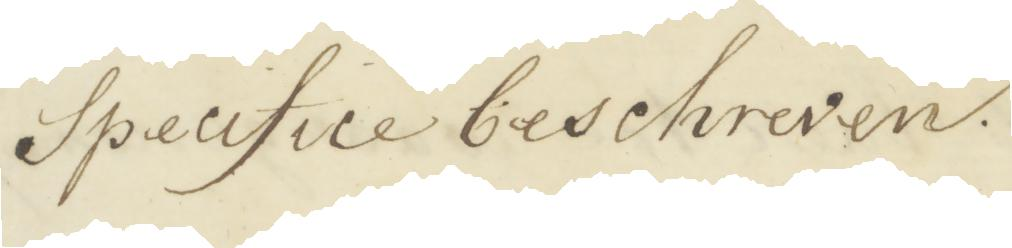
specifice beschreven.
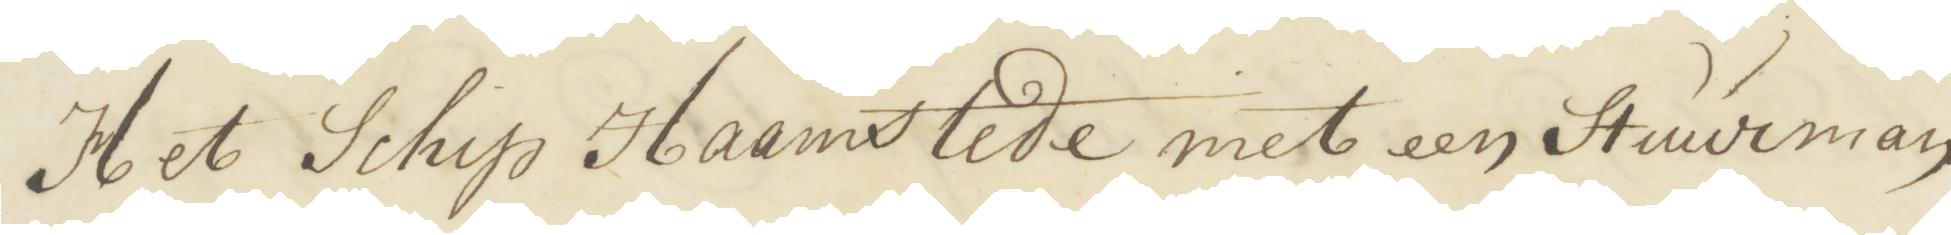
Het schip Haamstede met een Stuurman
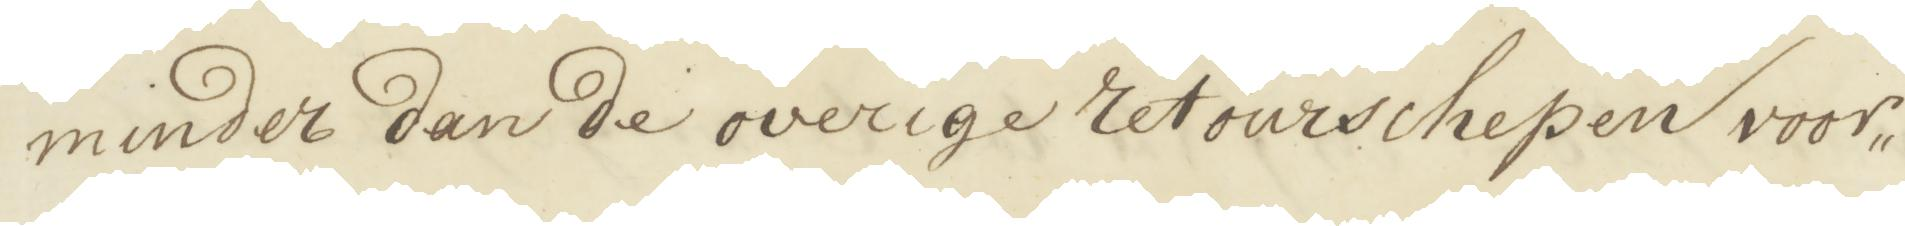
minder dan de overige retourschepen voor„
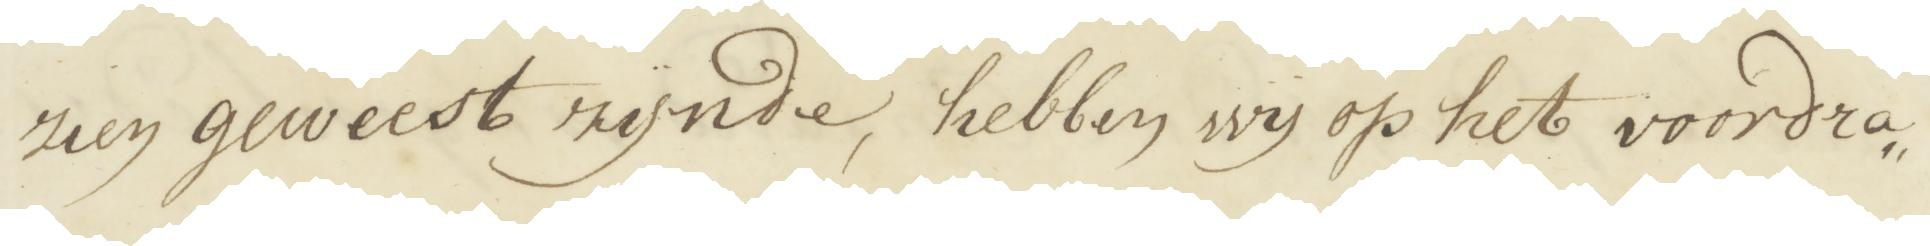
zien geweest zijnde, hebben wij op het voordra„
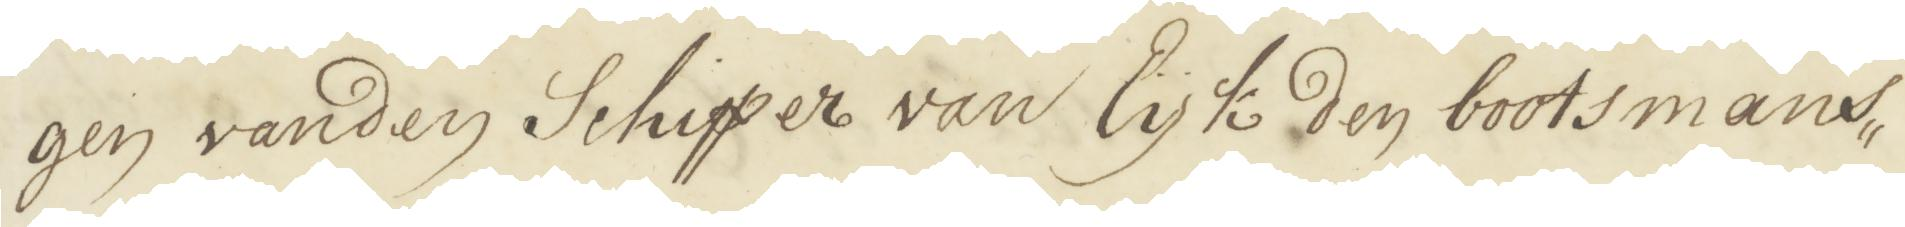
gen vanden schipper van Eijk den bootsmans„
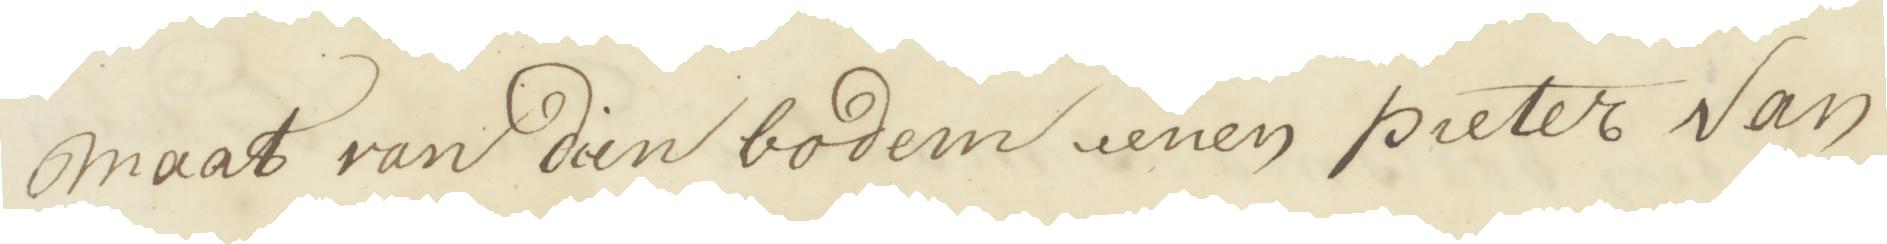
maat van dien bodem eenen pieter van
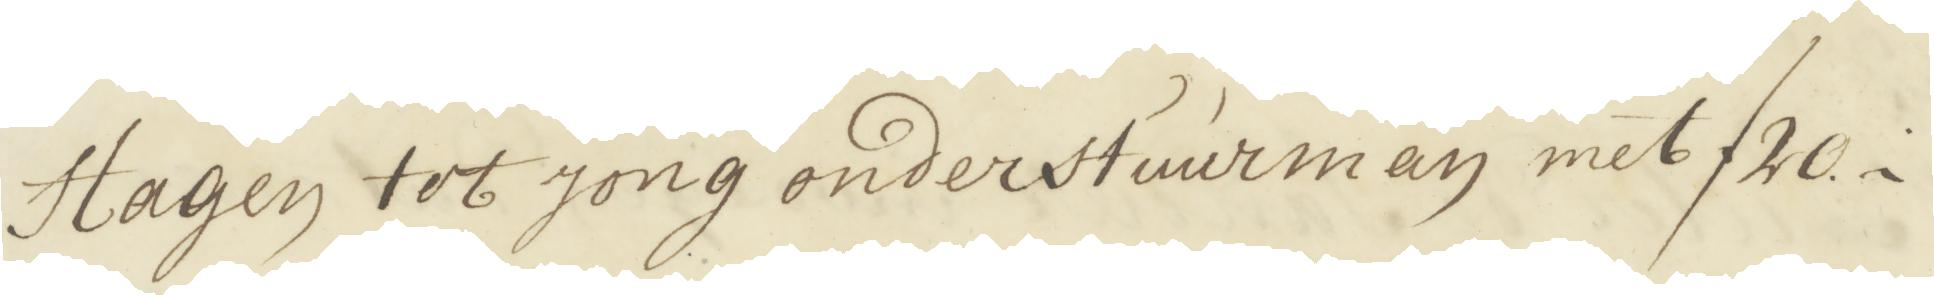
Hagen tot jong onderstuurman met ƒ20.—
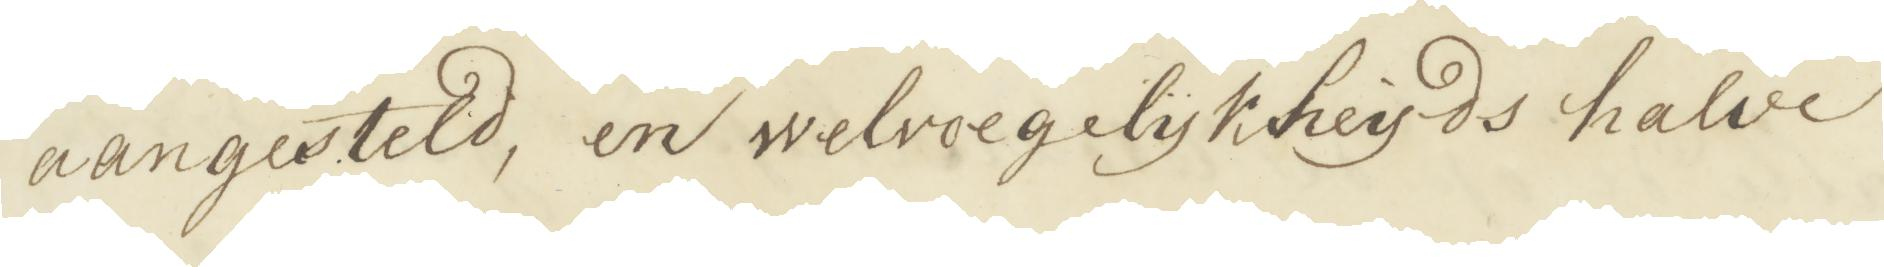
aangesteld, en welvoegelijkheijds halve
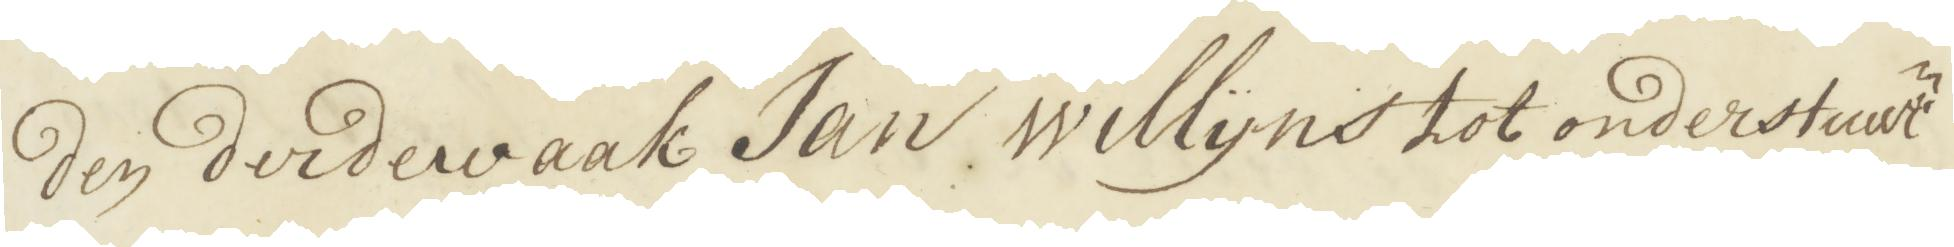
den derdewaak Ian willijns tot onderstuur„n
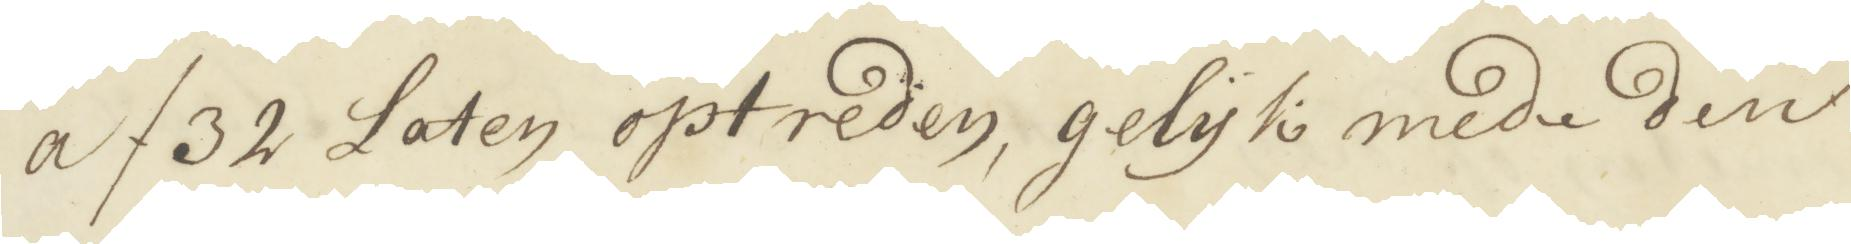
a ƒ 32 laten optreden, gelijk mede den
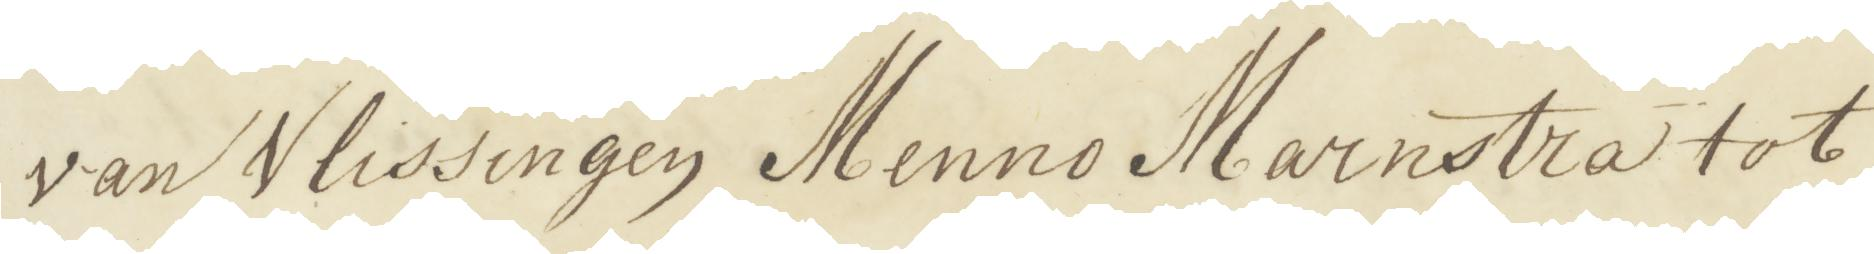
van Vlissingen Menno Marnstra tot
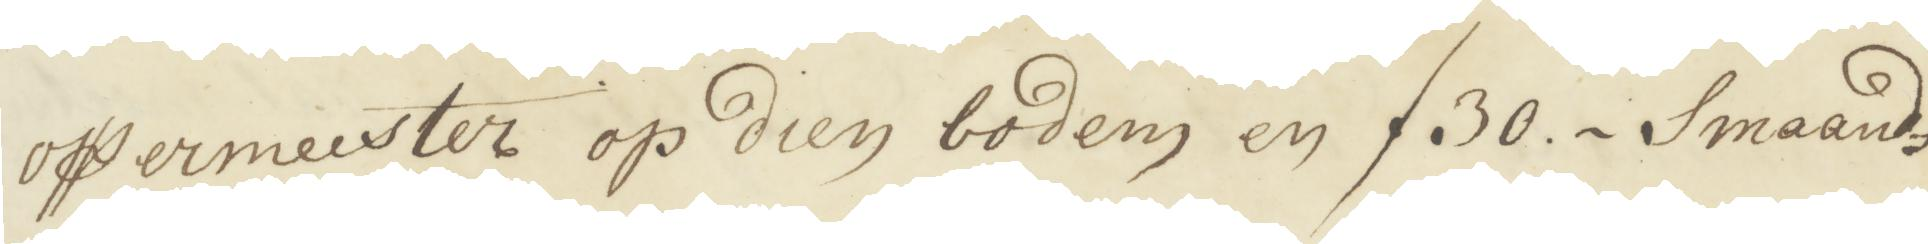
oppermeester op dien bodem en ƒ30.— smaands
